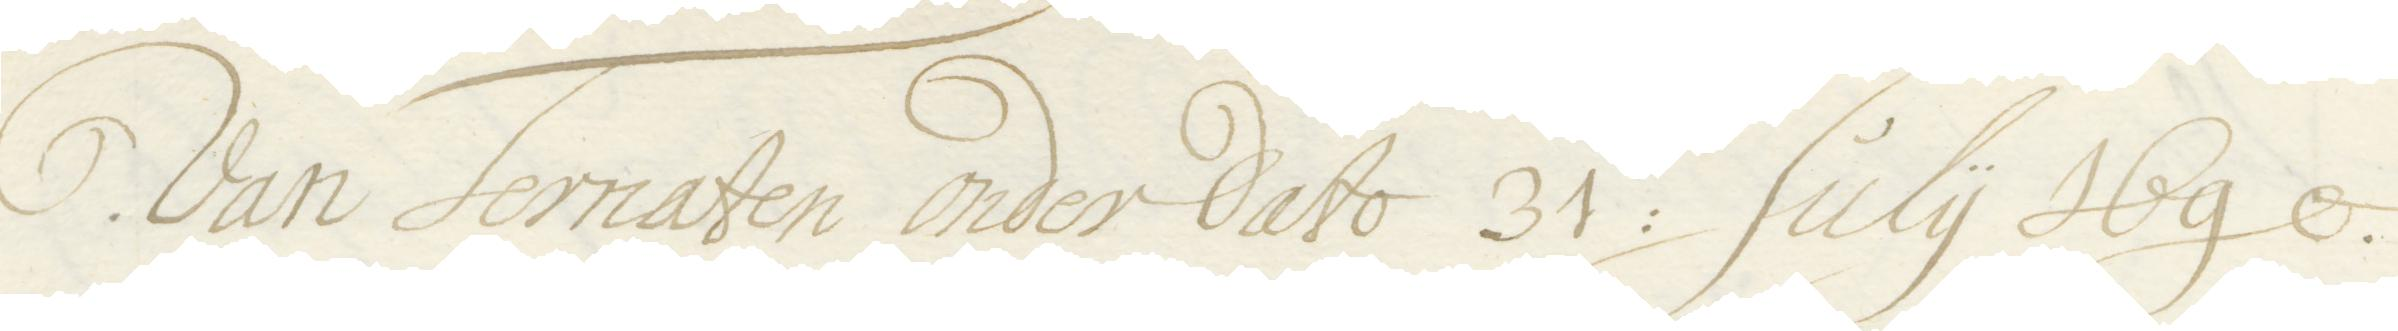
Van Ternaten onder dato 31:en Julij 1690.
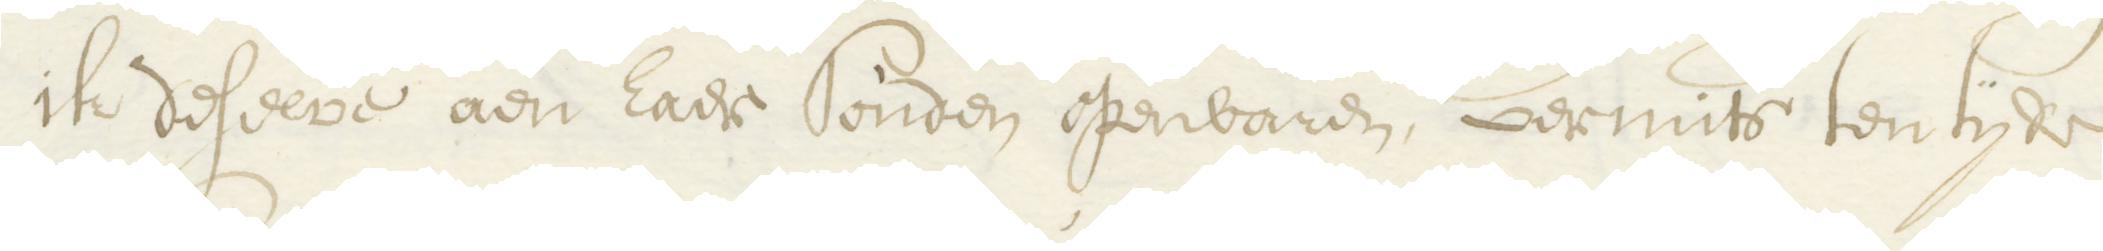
ik deselve aen haer souden openbaren, vermits ten tijde
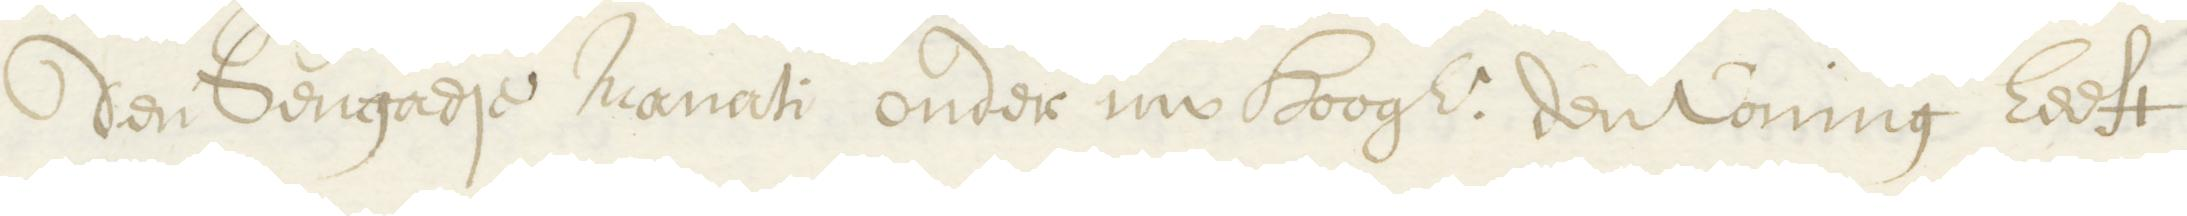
den sengadje manati onder uw Hoogh.t den Coning heeft
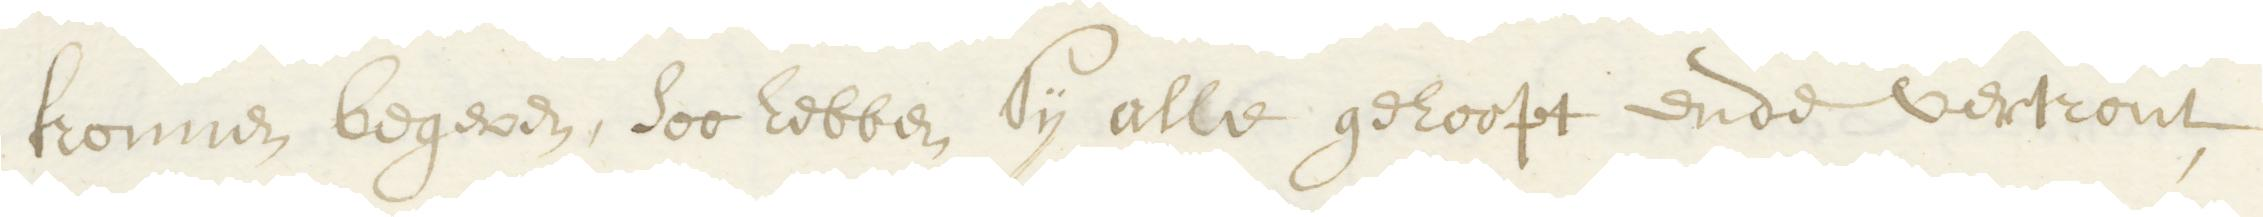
konnen begeven, soo hebben sij alle gehoopt ende vertrout,
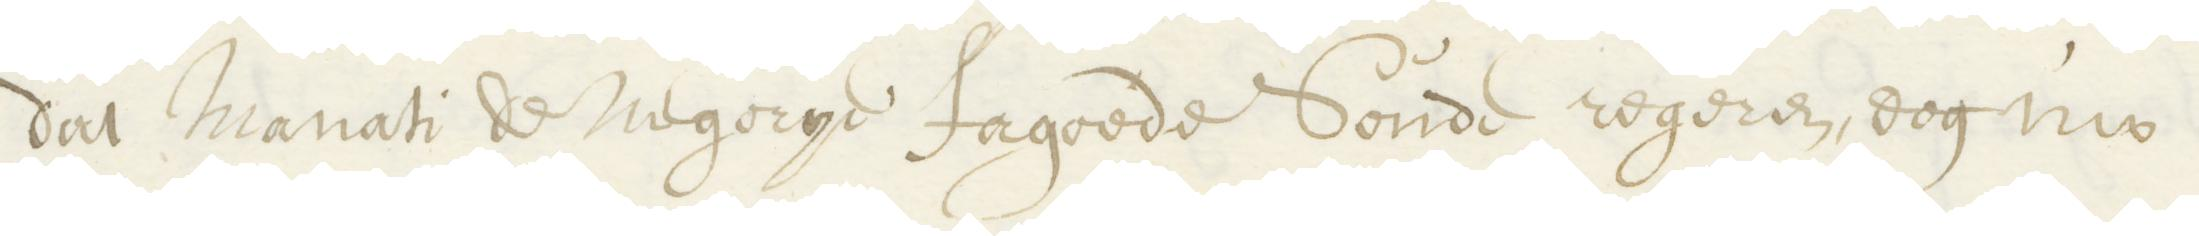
dat manati de negorije fagoede soude regeren, dog uw
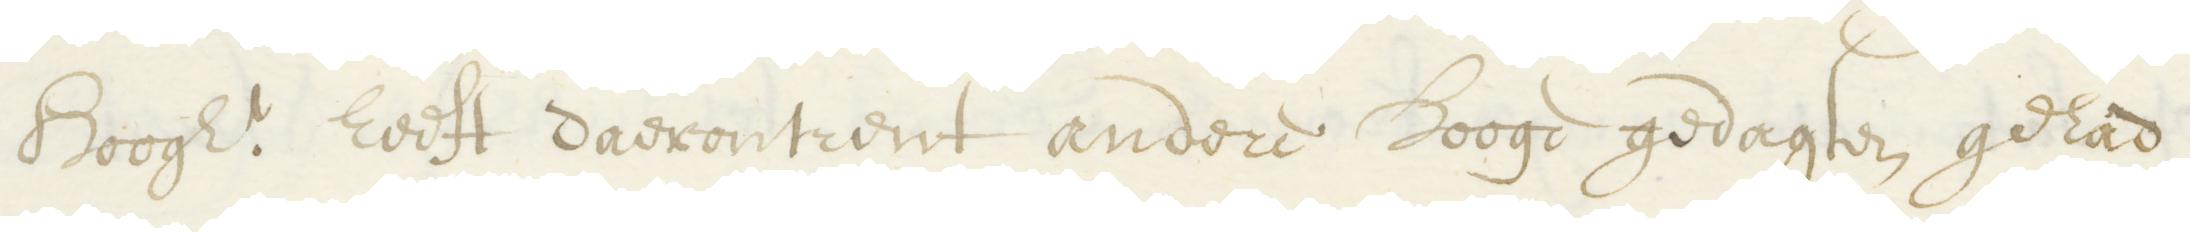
Hoogh.t heeft daerontrent andere hooge gedagten gehad
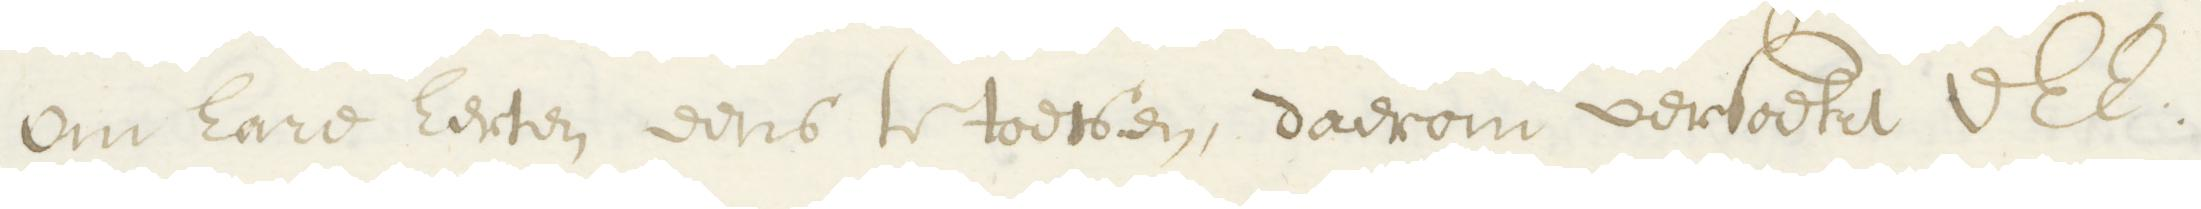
om hare herten eens te toetsen, daerom versoekt VEE:
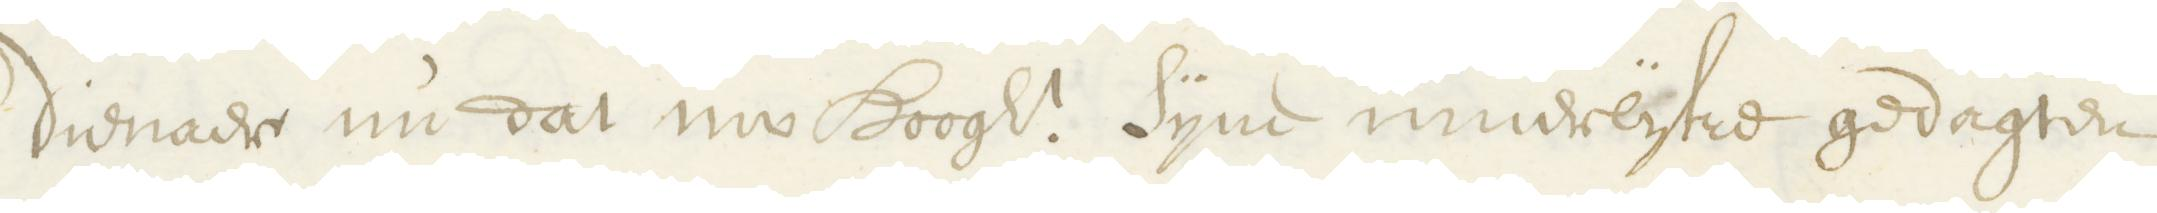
dienaer nu dat uw Hoogh.t sijne innerlijke gedagten
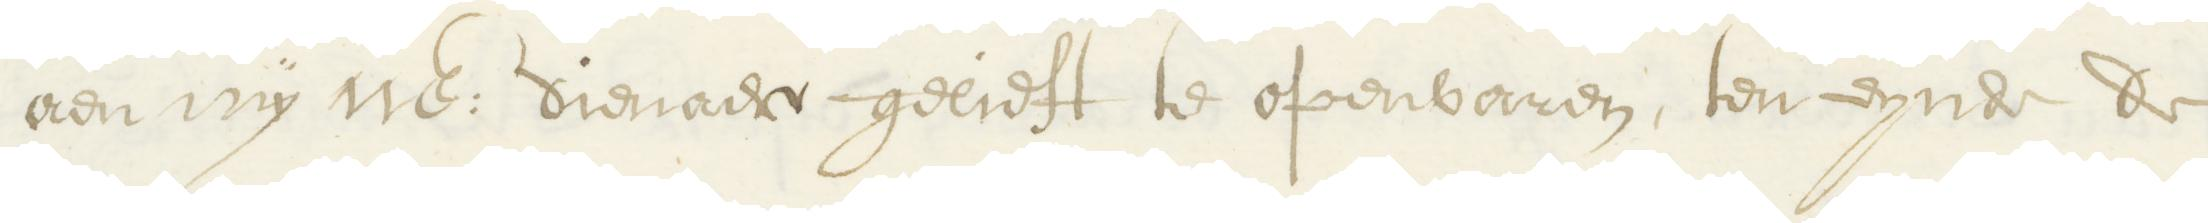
aen mij uE: dienaer gelieft te openbaren, ten eijnde de
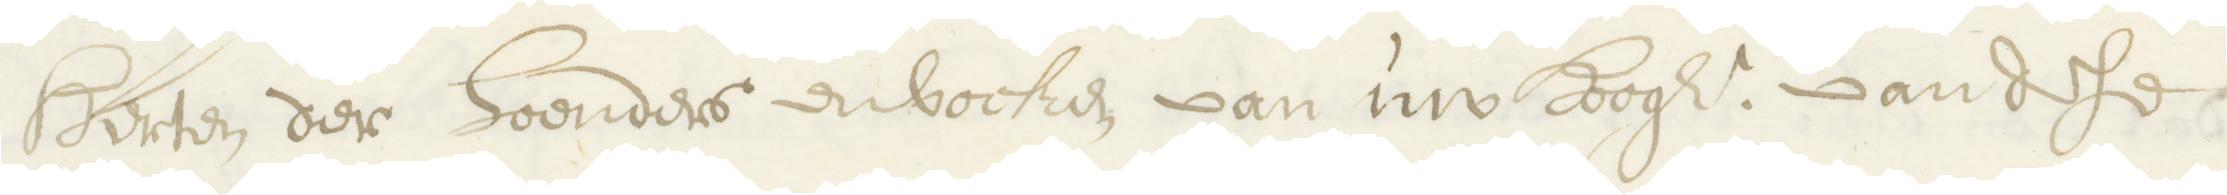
Herten der hoenders en bocken van uw Hoogh.t van dese
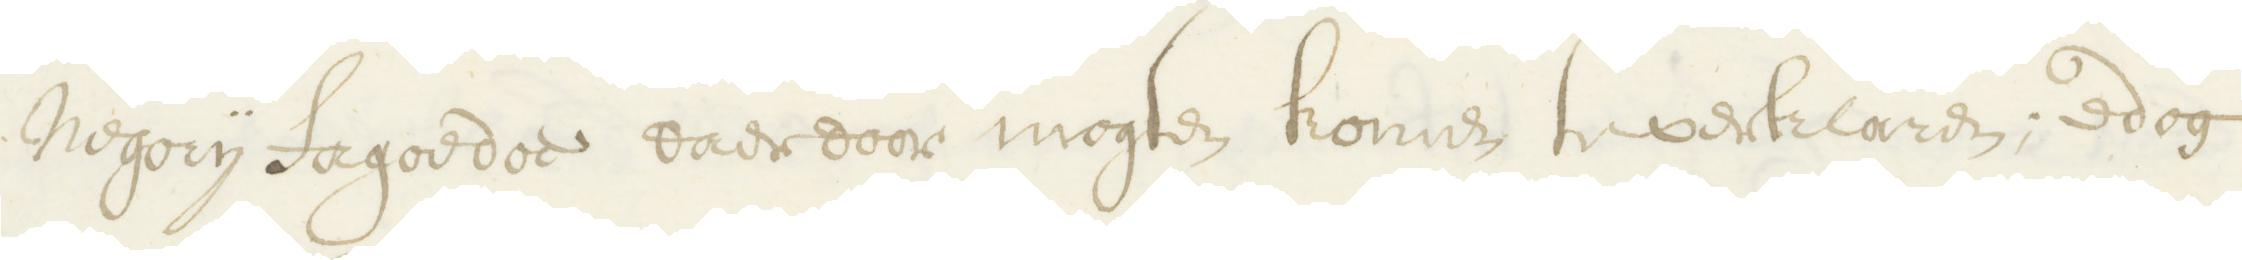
negorij fagoedoe daerdoor mogten komen te verklaren; edog
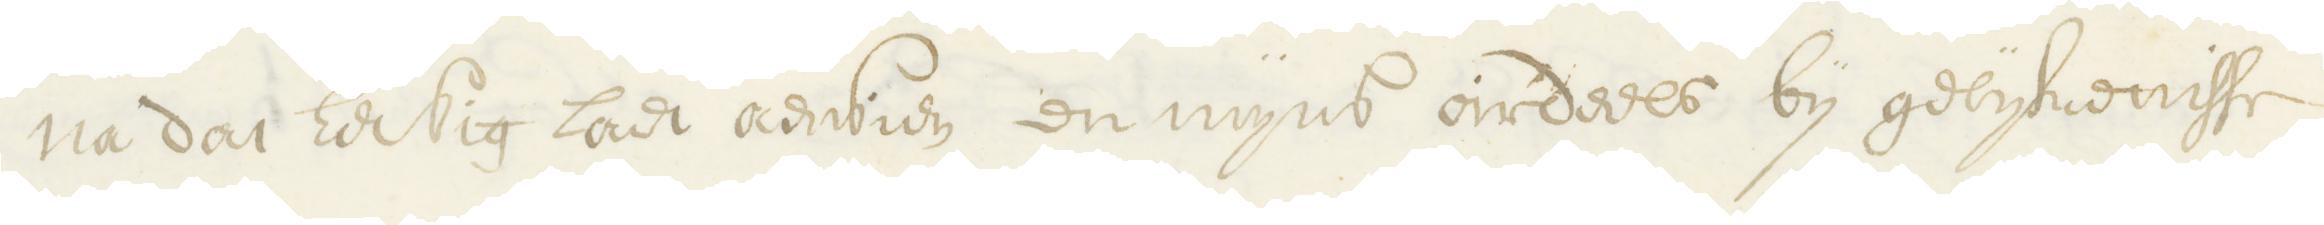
na dat het sig laet aensien en mijns oirdeels bij gelijkenisse
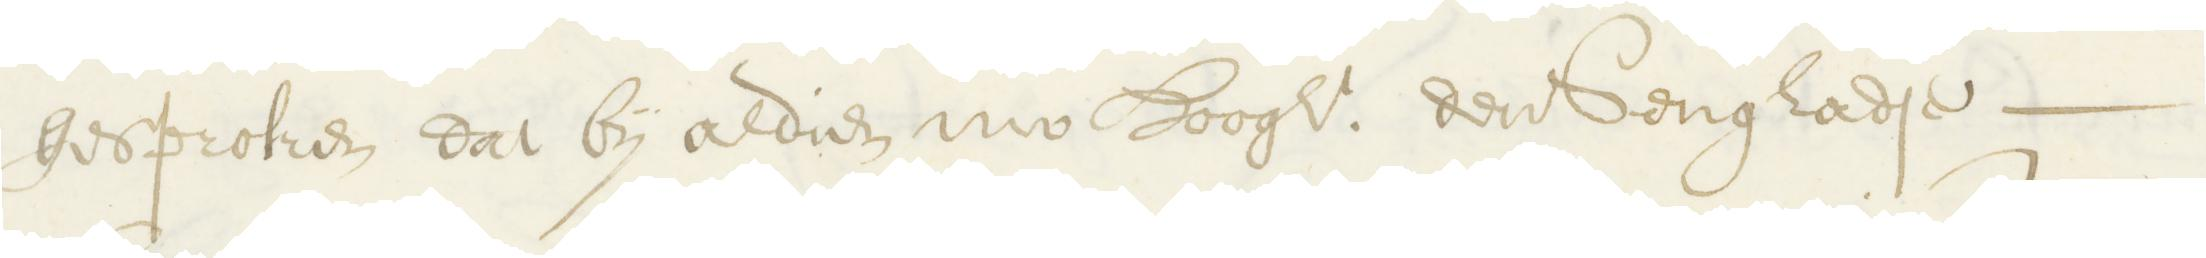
gesproken dat bij aldien uw Hoogh.t den senghadje —
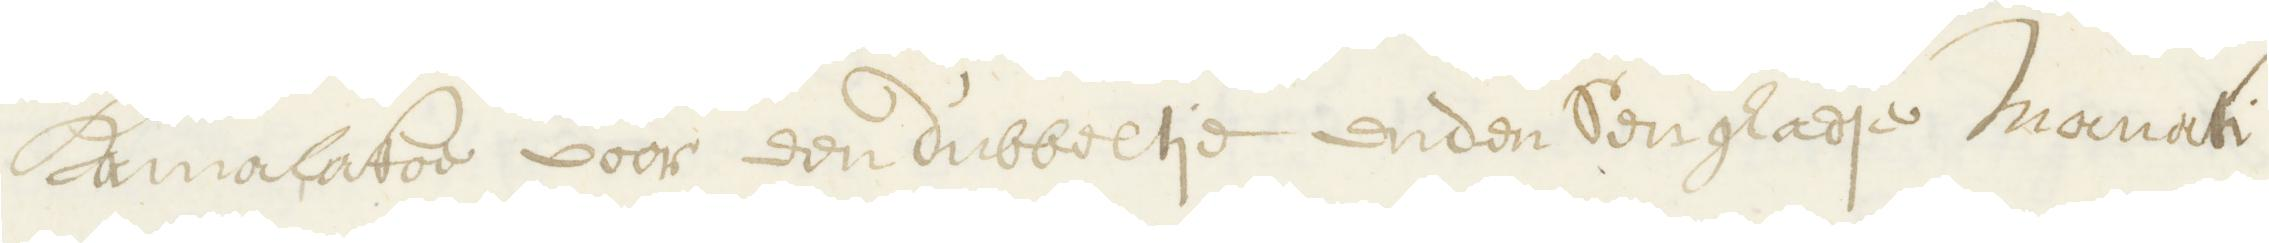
Hamalatoe voor een dubbeltje enden senghadje moenak
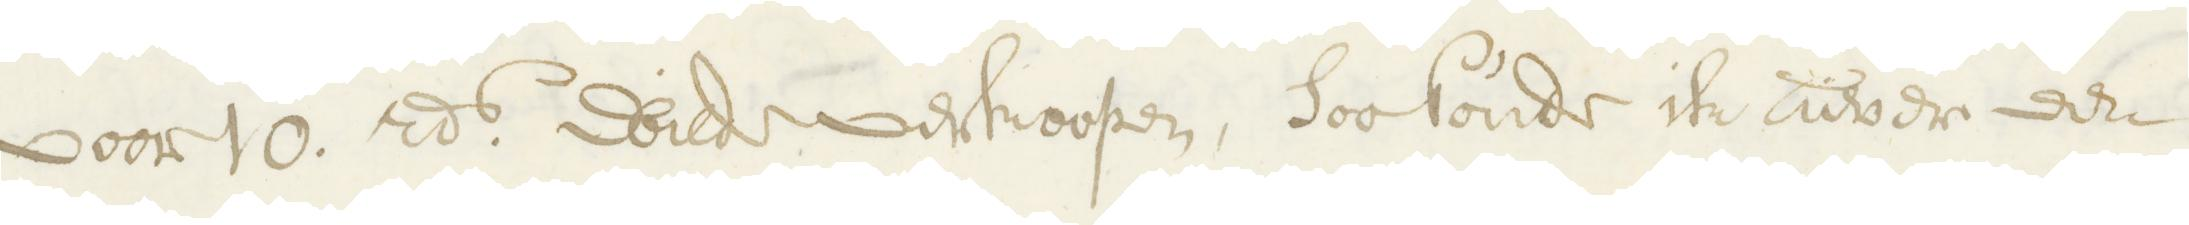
voor 10. rd.s wilde verkoopen, soo soude ik liever een
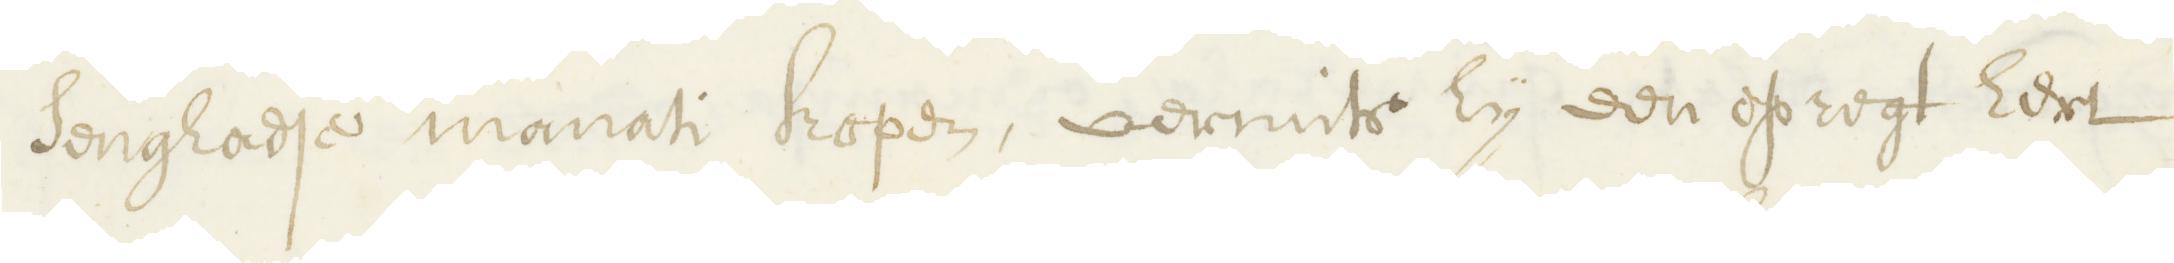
senghadje manati kopen, vermits hij een opregt hert
